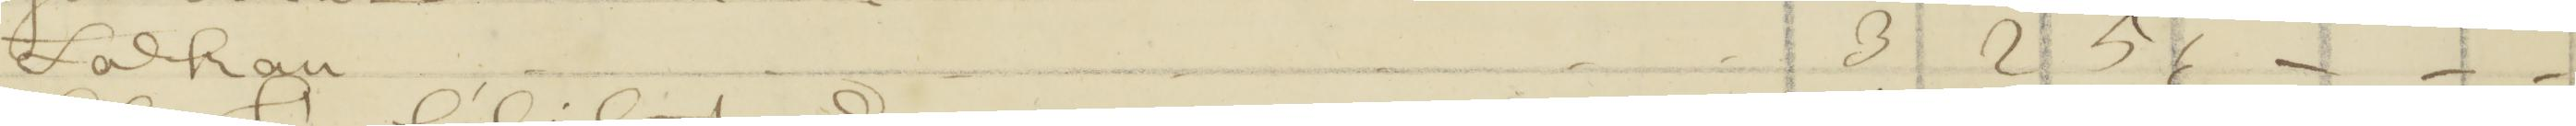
Soekan - - - - - - - 3 2 5 „ — — —
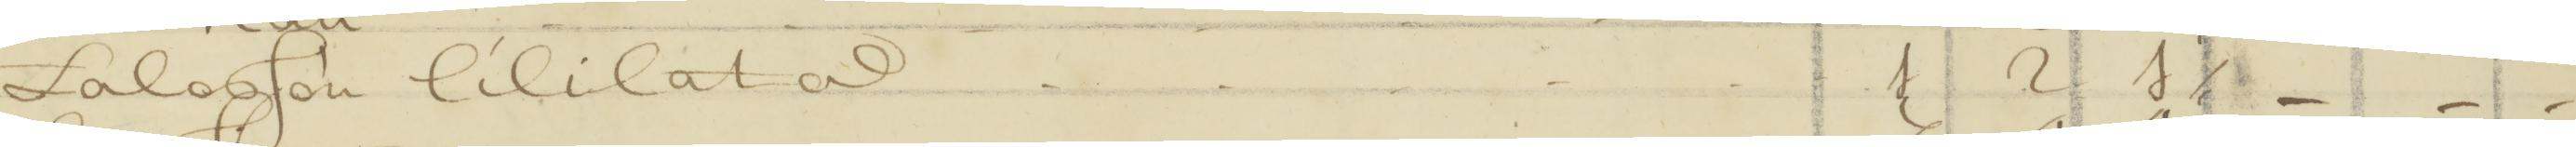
Salossou lililatae - - - - - 1 2 1 „ — — —
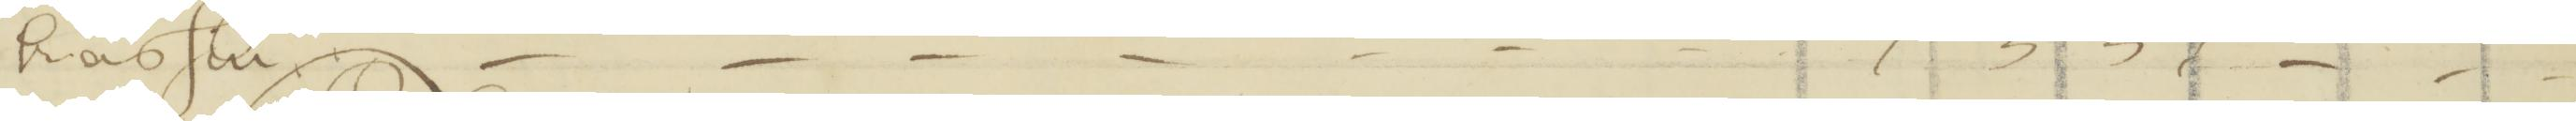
kassin – – – – – – – 7 5 5 „ — — —
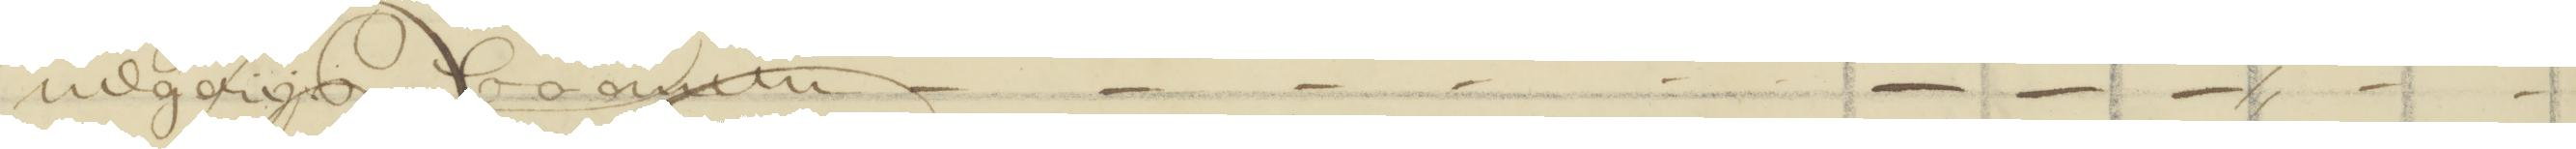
negorijs boomen – – – – - - — — —„ — —
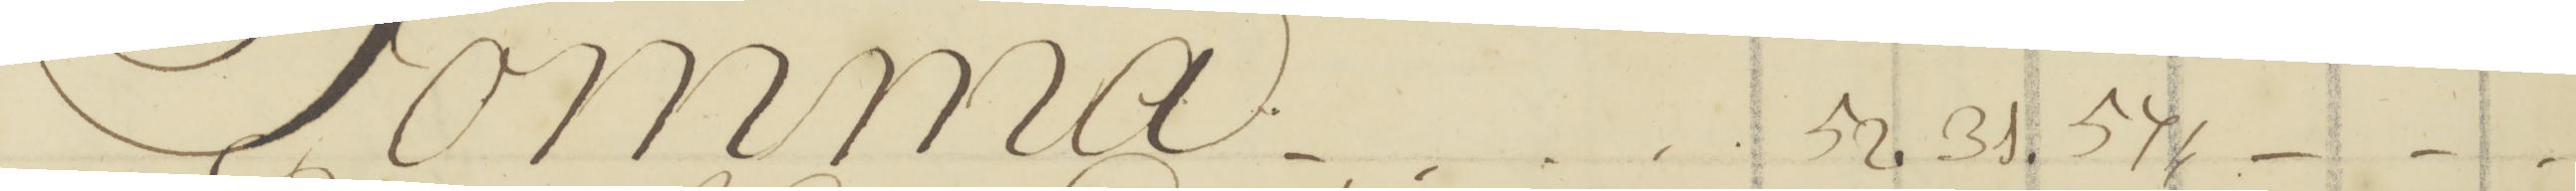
Somma – - - - . 52. 31. 57„ — — -
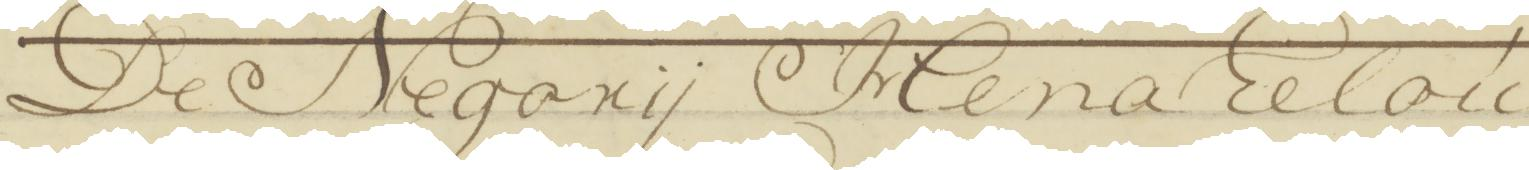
De Negorij Mena helou
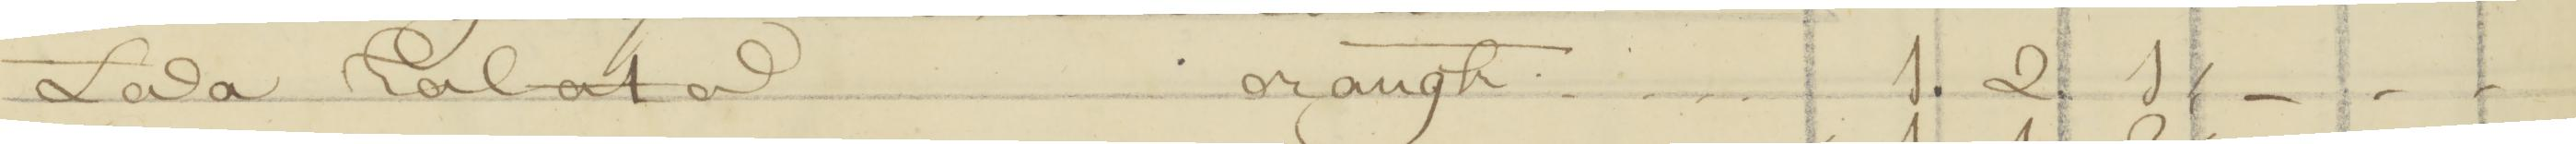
taea chalatae vrangk - - - . 1. 2. 1„— – –
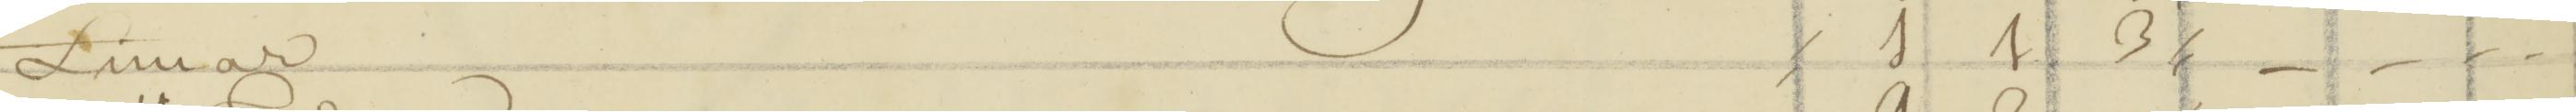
timar „ 1 1 3„ — — — -
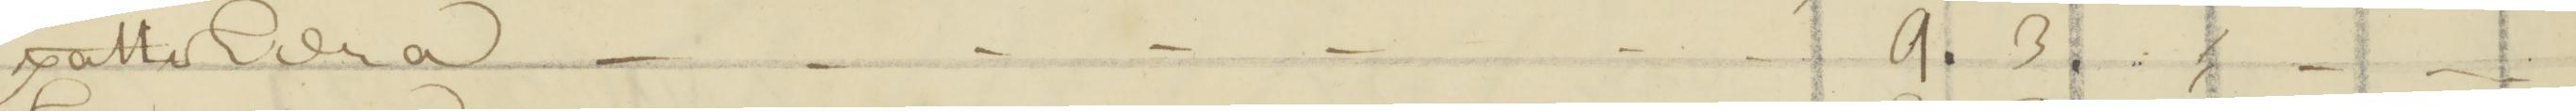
pattichera – – – – – – – 9. 3. „ — — —
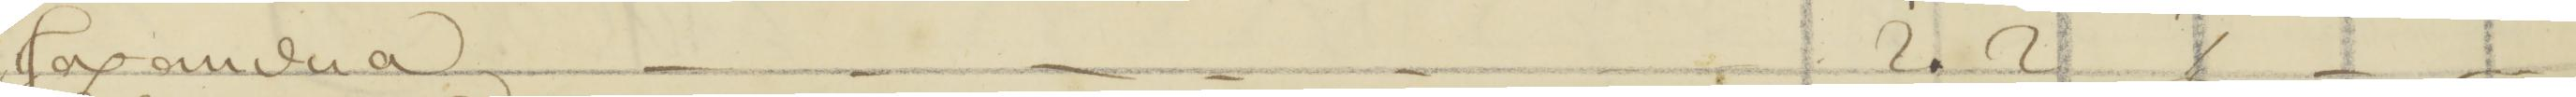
sapamena – – – – – - - . 2. 2 „ — — —
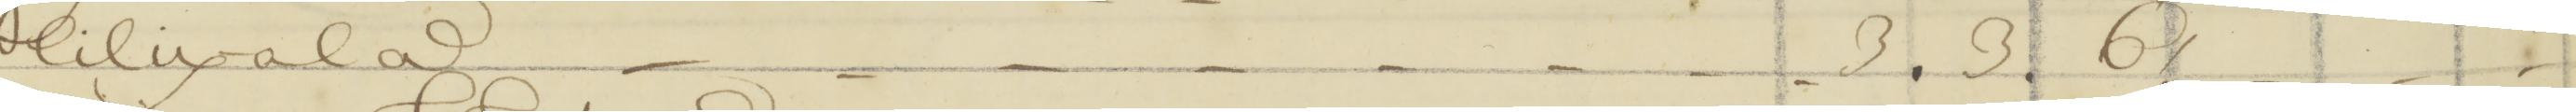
lilipaloe – – – – – – – - 3. 3. 6 „ — — —
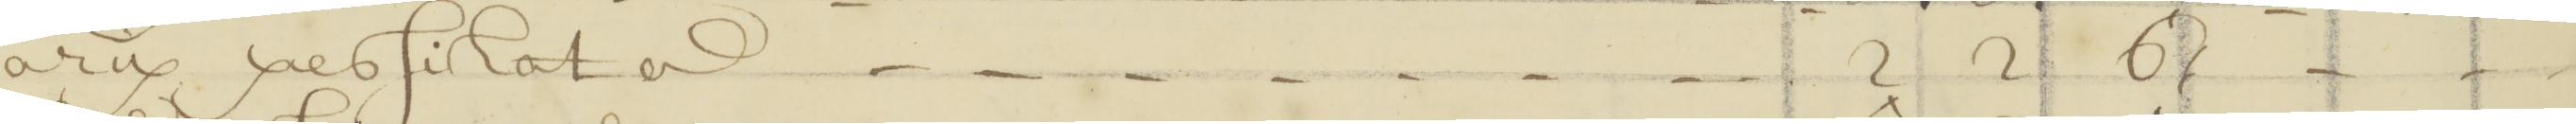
arip pessichatae – – – – – – – – 2 2 6 „ — — —
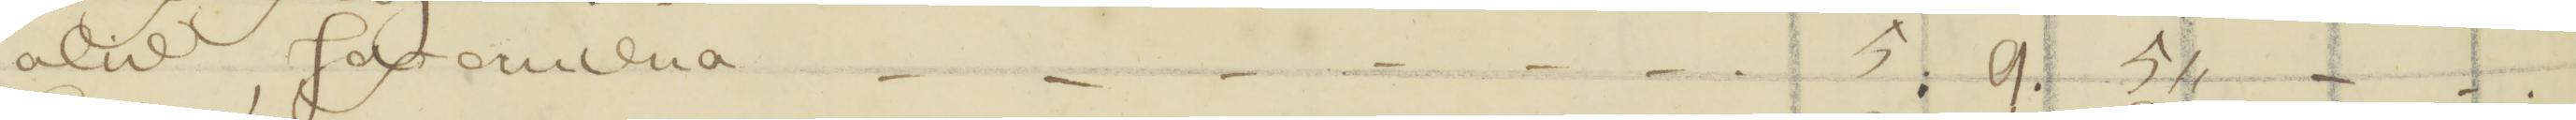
alie sapomena – – – – – – . 5: 9. 5 „ — - .
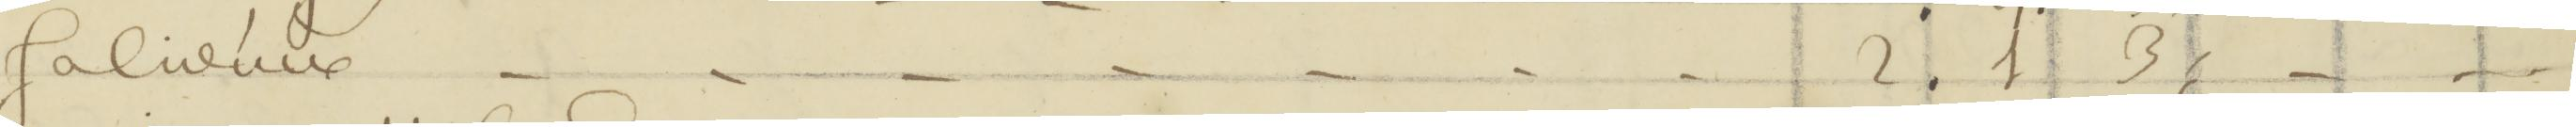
salieuw – – – – – – – 2. 1 3 „ — — -
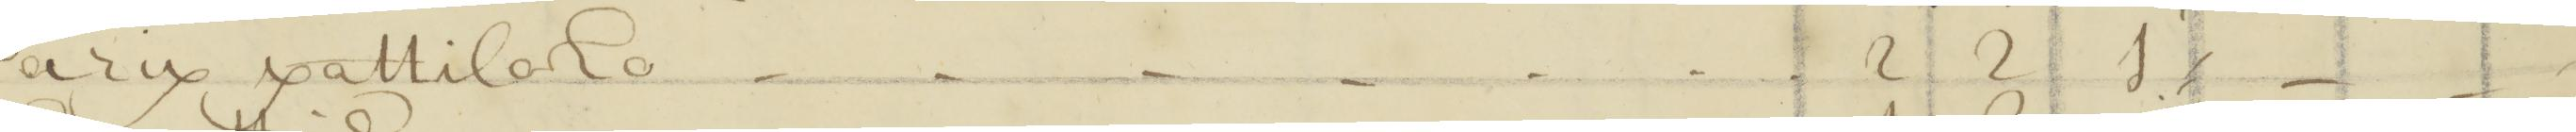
arip pattilocho – – – – – – . 2 2 1„— —
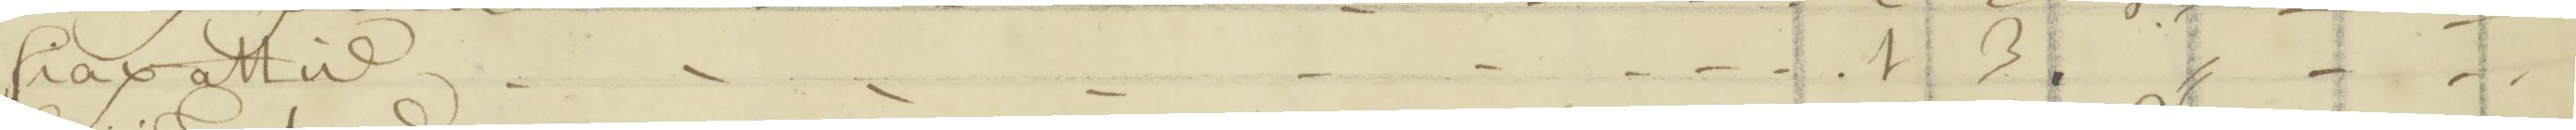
siapattie - – – – – – – – . 1 3. „ — — -
